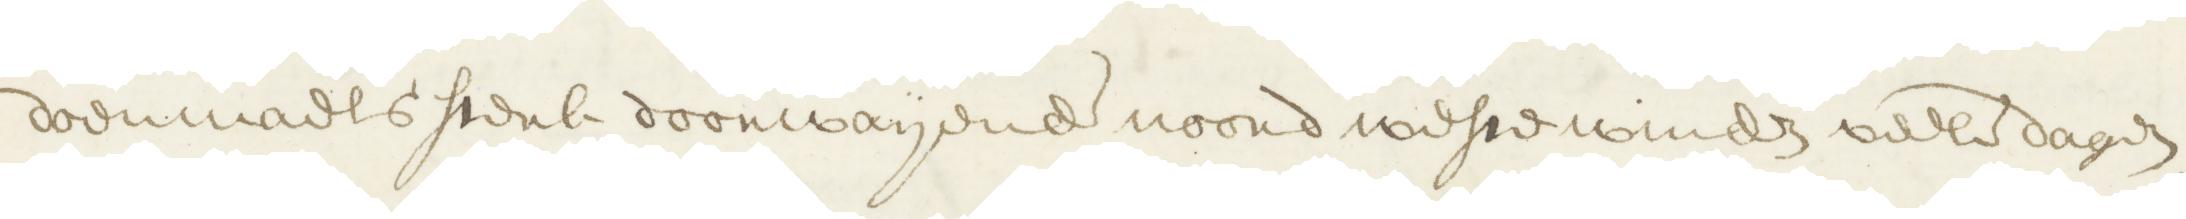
doenmaels sterk doorwaijende noord weste winden veele dagen
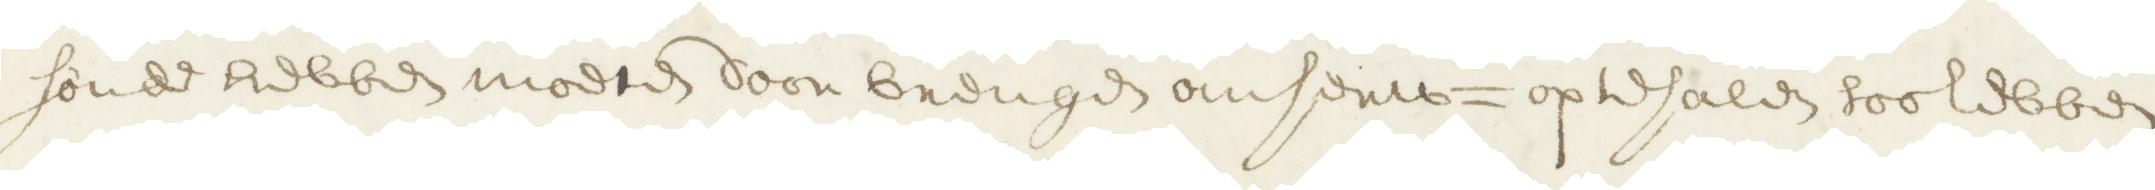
soude hebben moeten door brengen om herw=ts op te halen soo hebbe
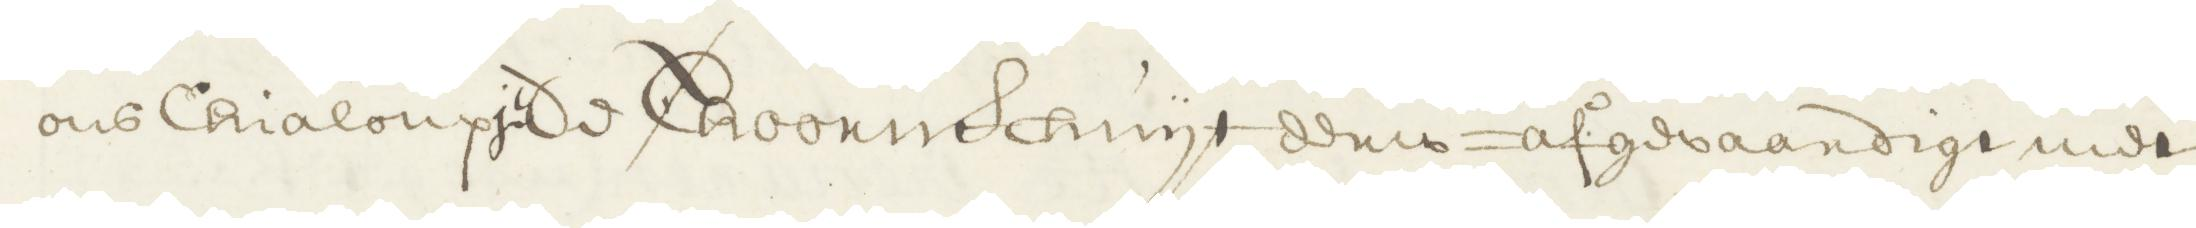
ons Chialoupje de Thoornschuijt derw=ts afgevaardigt met
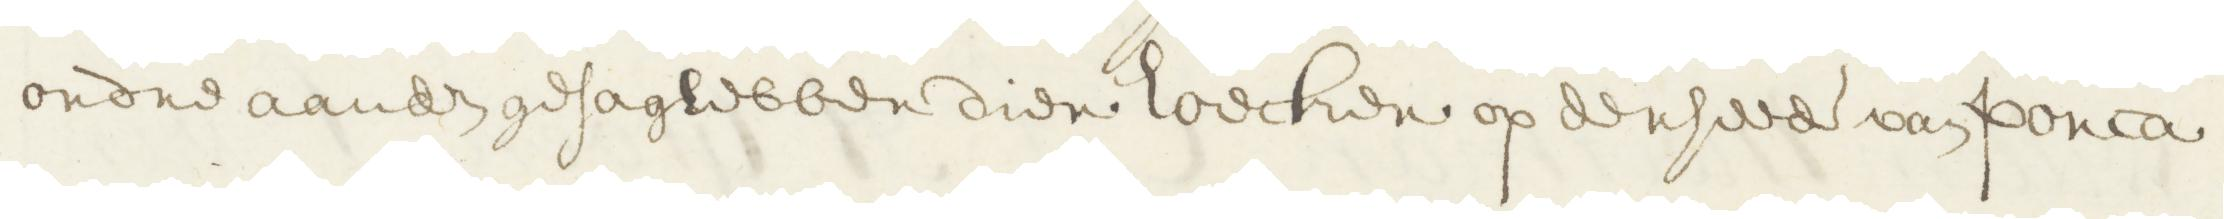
ordre aan den gesaghebber dier hoecker op der heede van porca
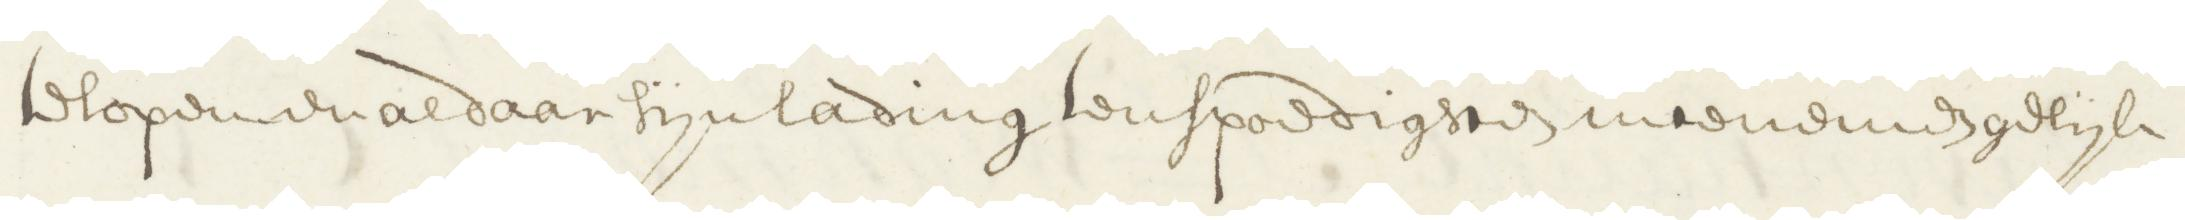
te lopen en aldaar sijn lading ten spoedigsten in te nemen gelijk
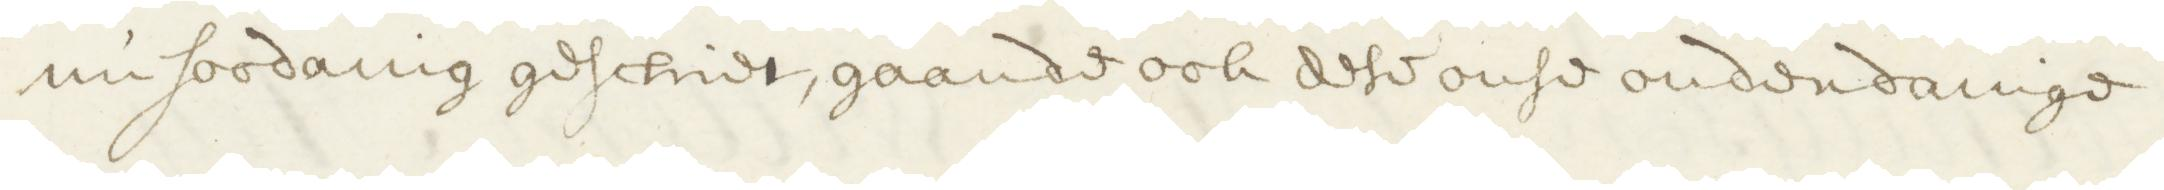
nu soodanig geschiet, gaande ook dese onse onderdanige
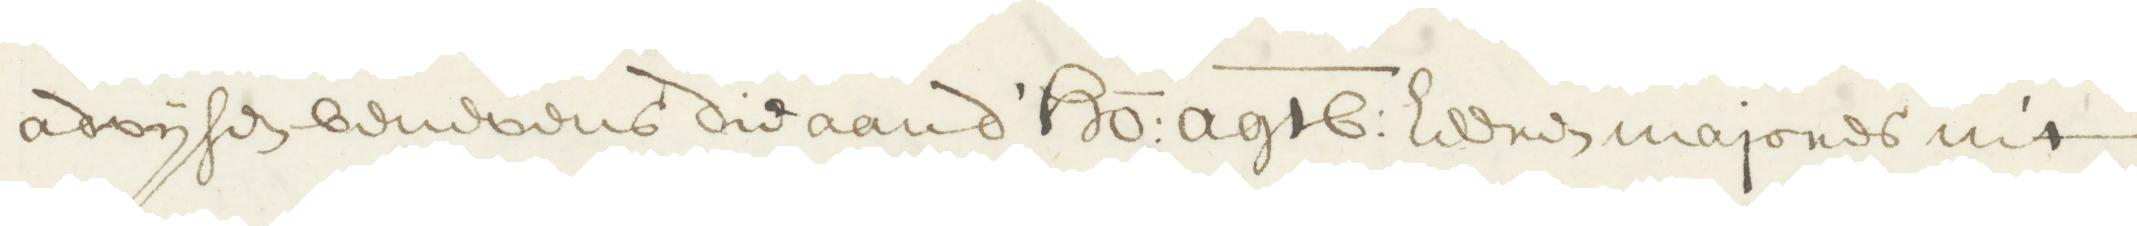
advijsen benevens die aan d’ Ho: agtb: heeren majores in ’t
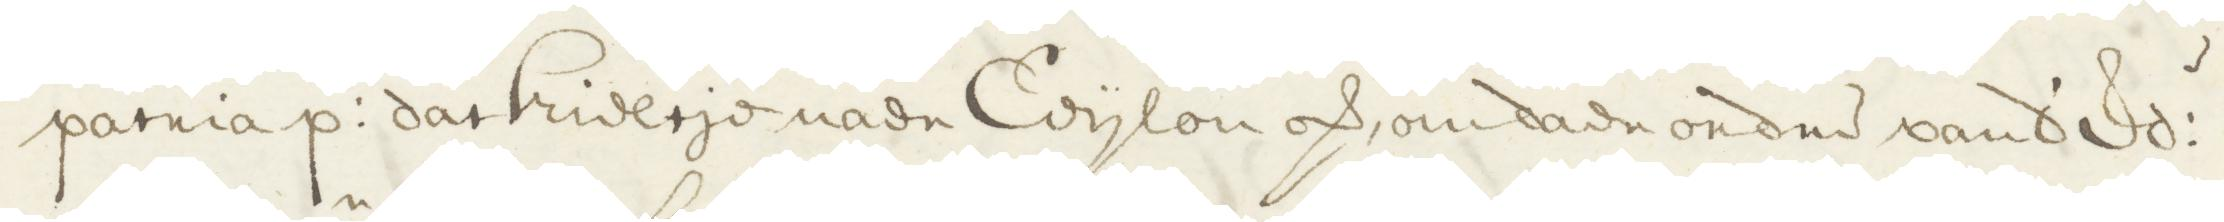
patria p:r dat kieltje naer Ceijlon over, om daer ordre van d'Ed:e
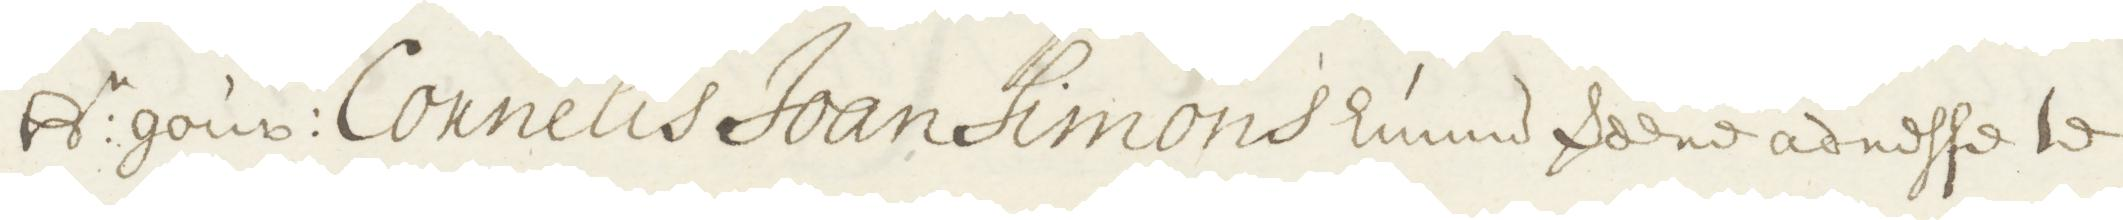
H:r gouv:r Cornelis Ioan Simons 's hunne verdere adresse te
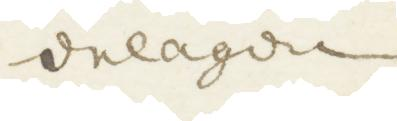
erlagen
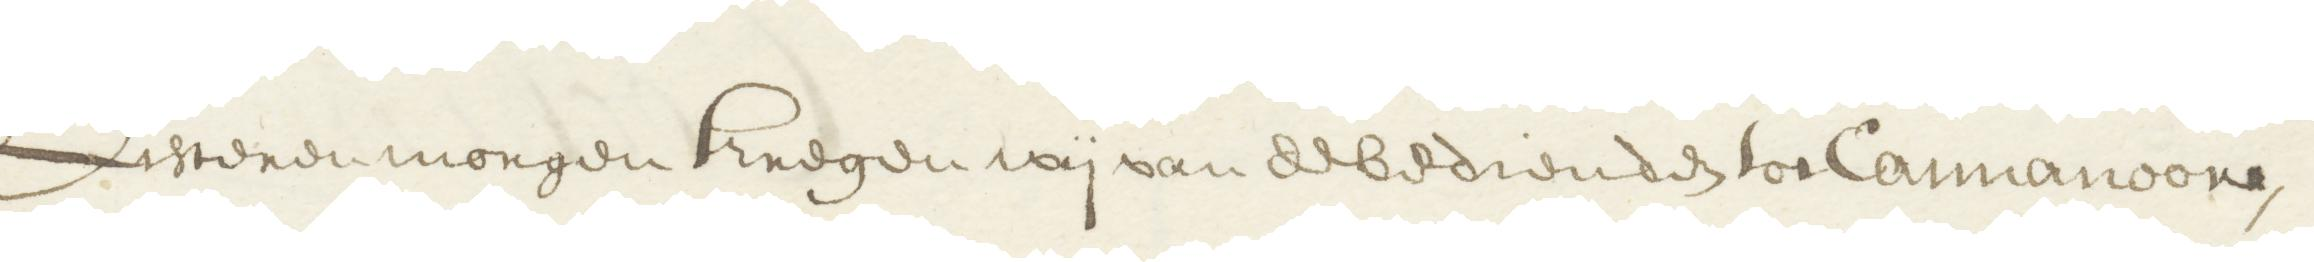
isterenmorgen kregen wij van de bedienden tot Cannanoor,
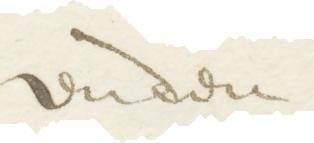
en den
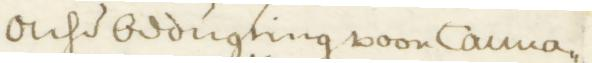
onse bedugting voor canna„
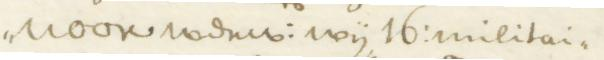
„noor werw:ts wij 16: militai„
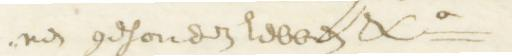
„ren gesonden hebben &=a
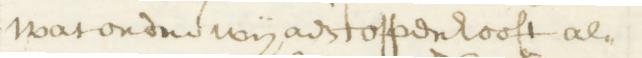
wat ordre wij aen 't opperhooft al„
